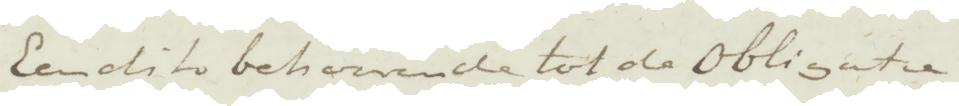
Een dito behoorende tot de Obligatie
